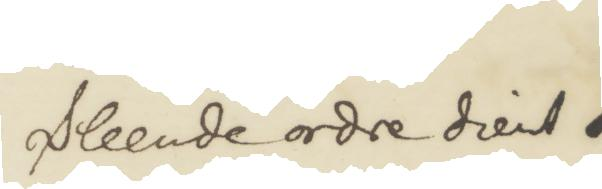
verleende ordre dient
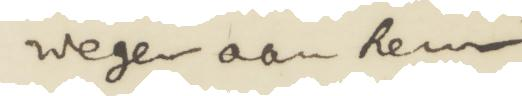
wegen aan hem
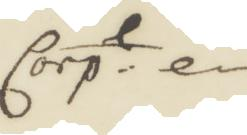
Corp:l en
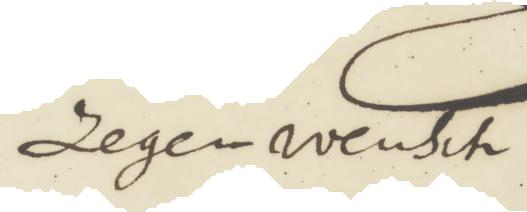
zegen wensch
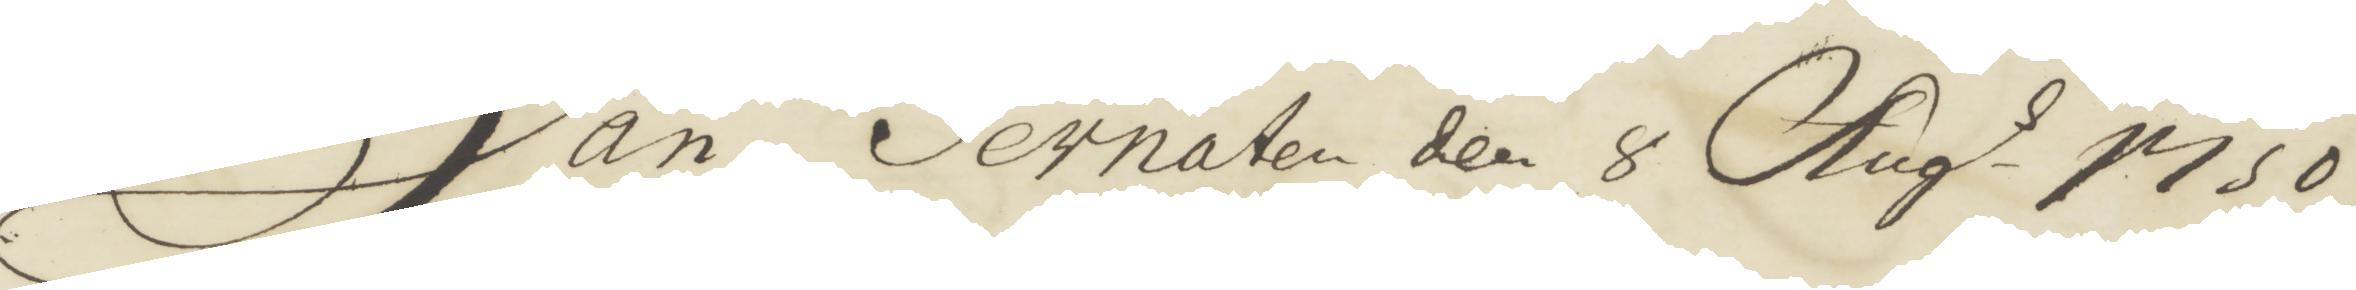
Van Ternaten den 8 Aug-s 1750
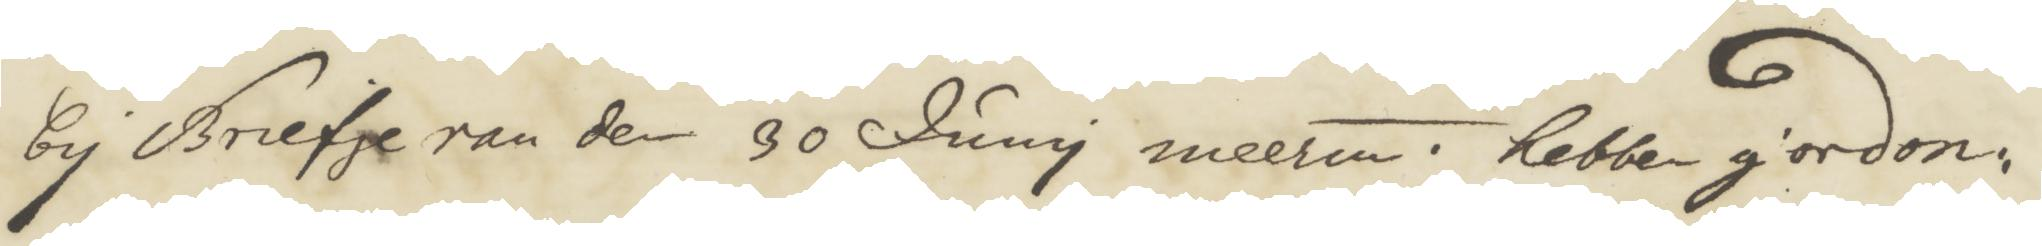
bij Briefje van den 30 Iunij meerm. hebben g’ordon„
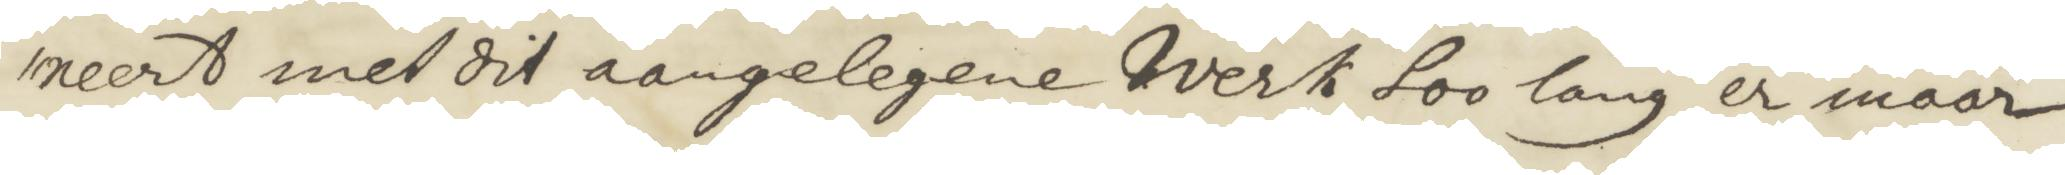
„neert met dit aangelegene werk soo lang 'er maar
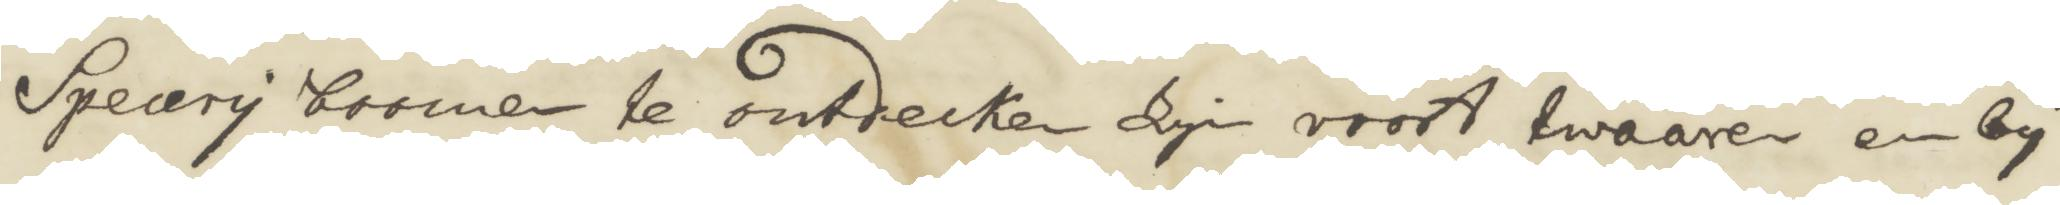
specerij boomen te ontdecken zijn voort twaaren en bij
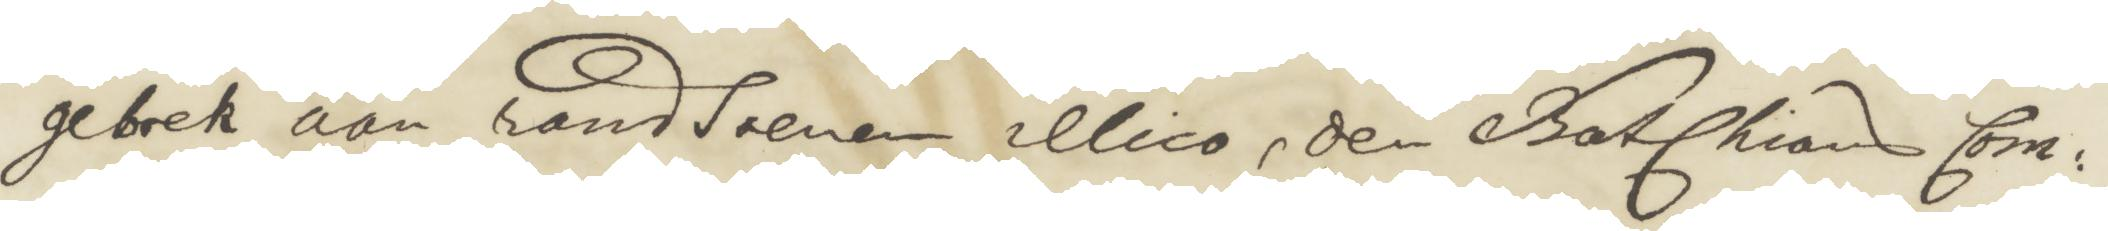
gebrek aan randsoenen illico, den Batchian Com„
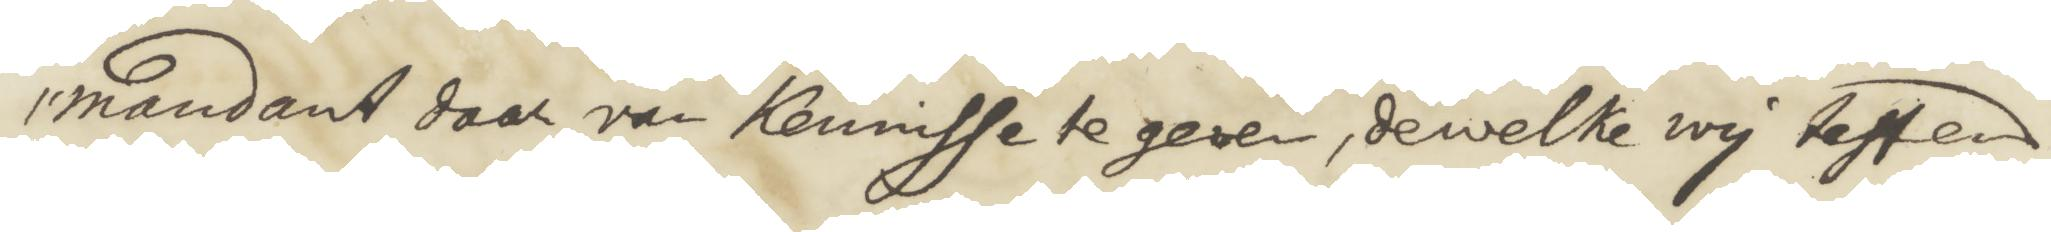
„mandant daar van Kennisse te geven, dewelke wij teffens
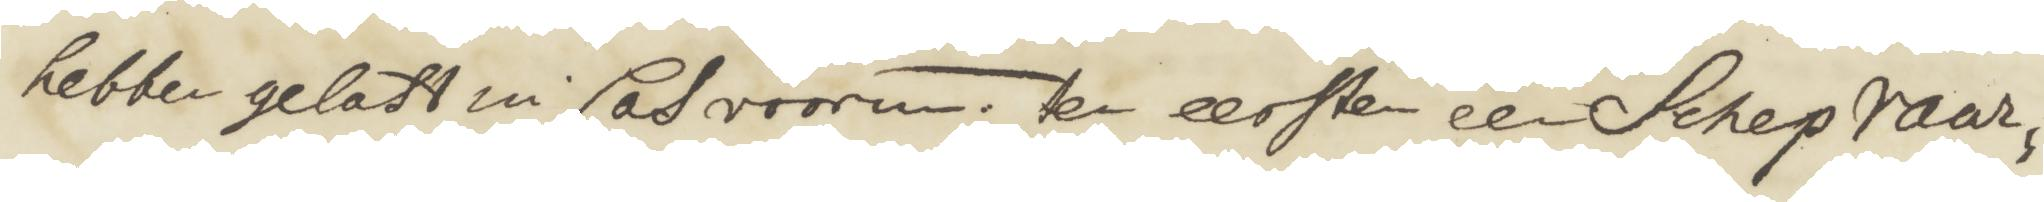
hebben gelast in Cas voorm: ten eersten een schep vaar„
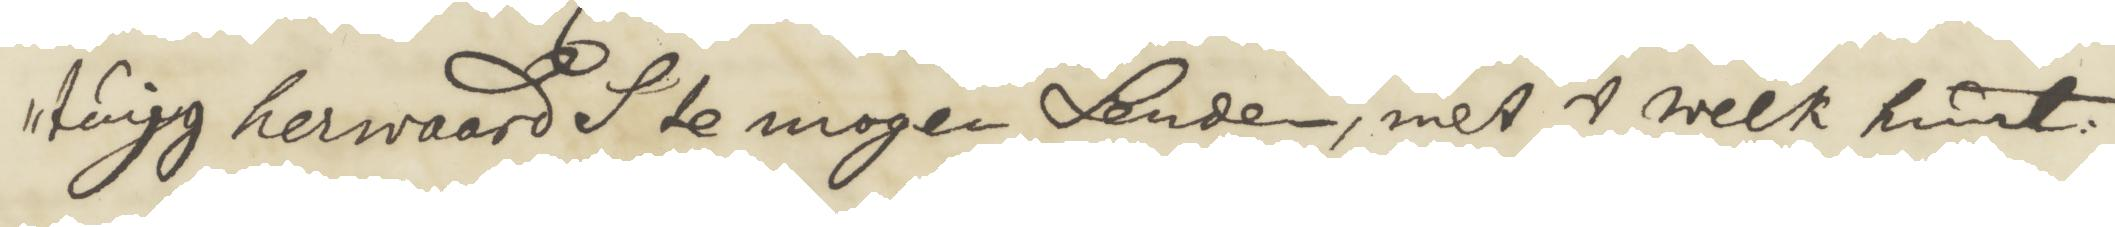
„tuijg herwaards te mogen senden, met ’t welk hunl:
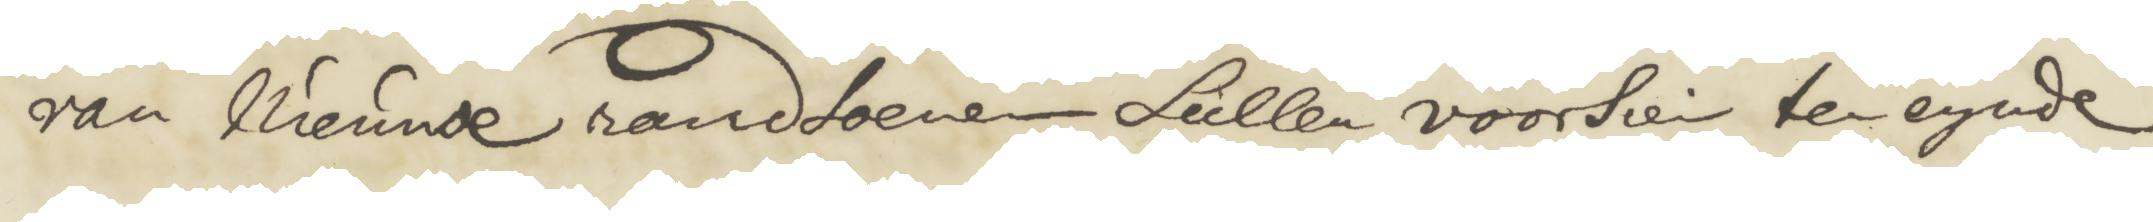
van nieuwe randsoenen sullen voorsien ten eijnde
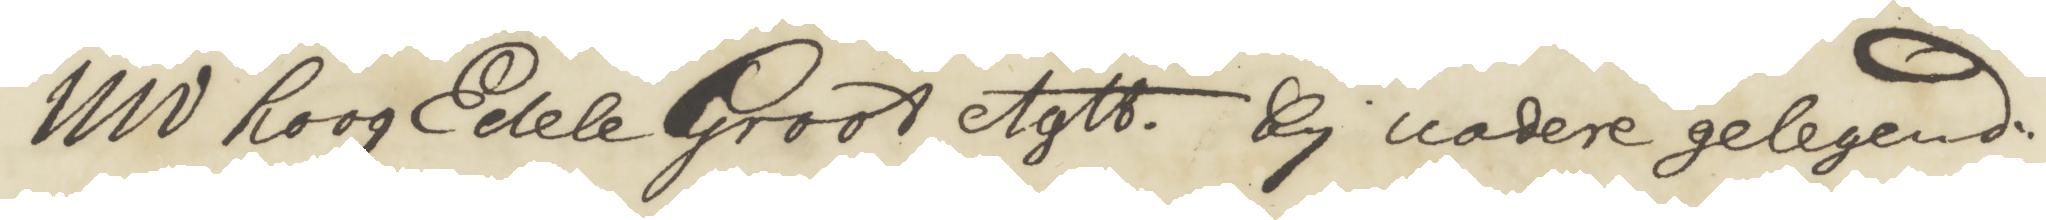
Uw hoog Edele Groot Agtb. bij nadere gelegend„
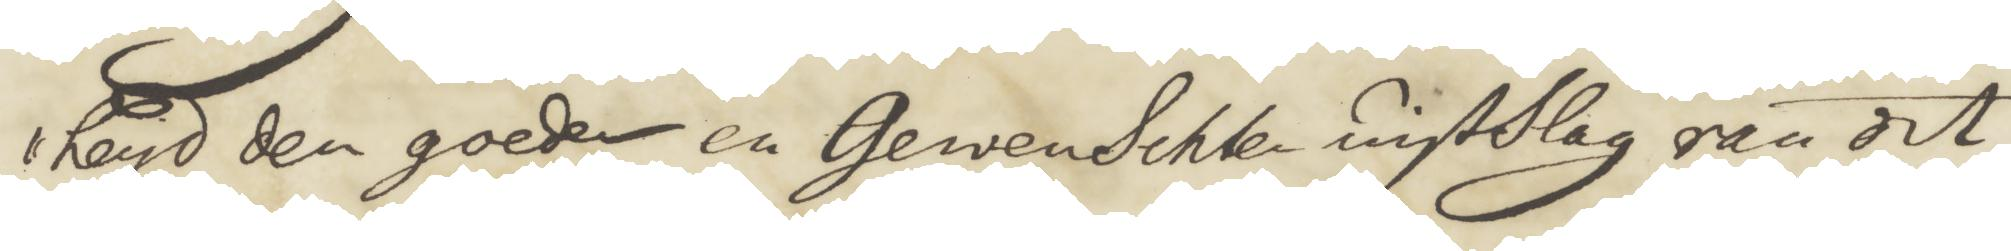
„heijd den goeden en gewenschten uijtslag van dit
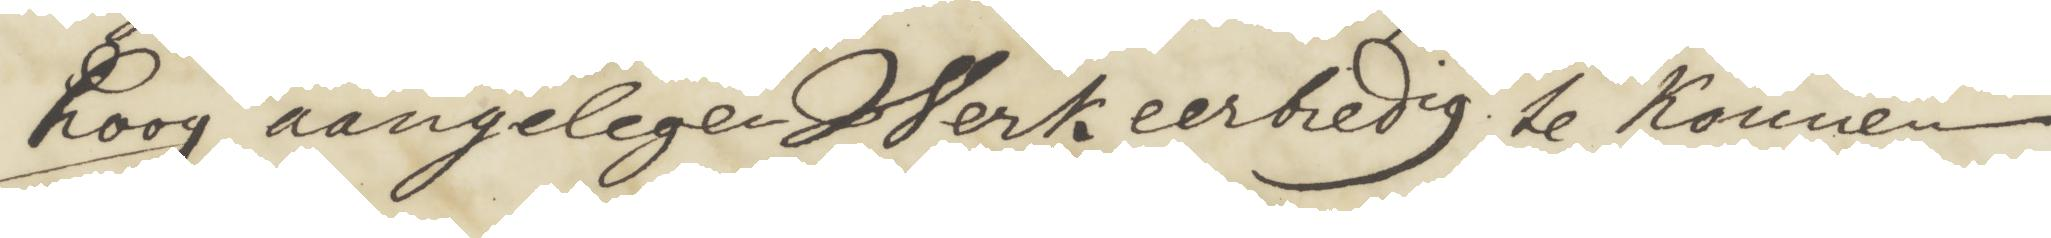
hoog aangelegen Werk eerbiedig te konnen
